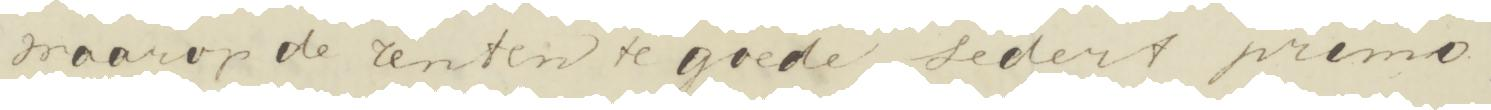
waarop de renten te goede sedert primo
